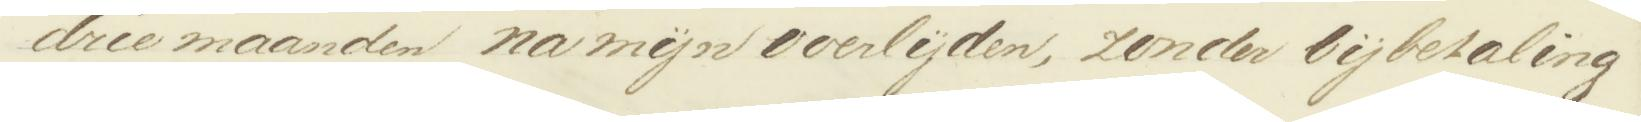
drie maanden na mijn overlijden, zonder bijbetaling
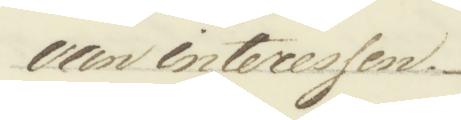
van interessen.
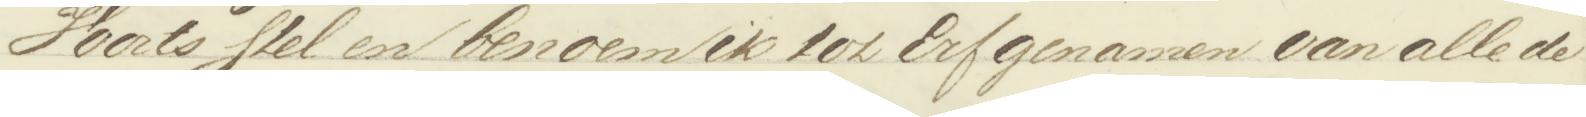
Voorts stel en benoem ik tot Erfgenamen van alle de
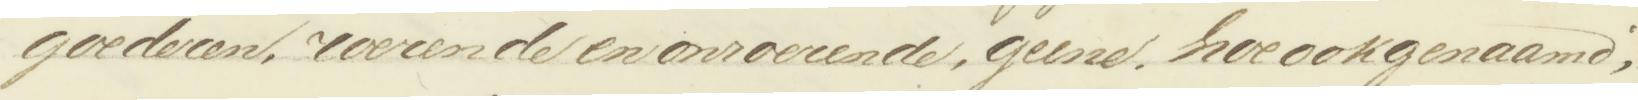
goederen, roerende en onroerende, geene, hoe ookgenaamd,
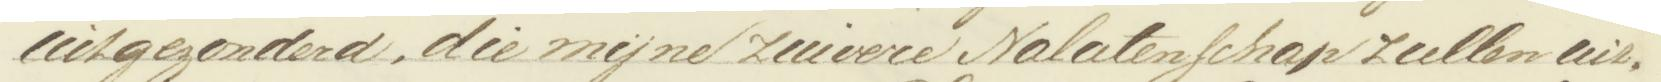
uitgezonderd, die mijne zuivere Nalatenschap zullen uit„
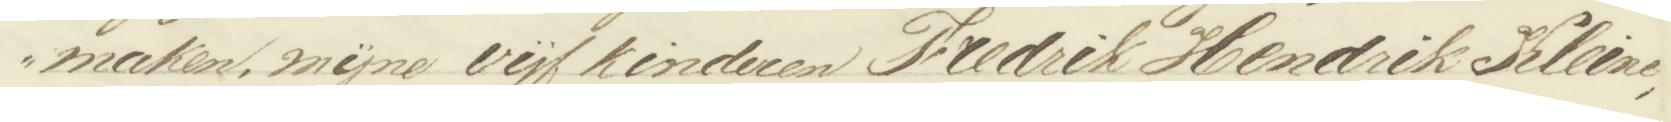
„maken, mijne vijf kinderen Fredrik Hendrik Kleine,
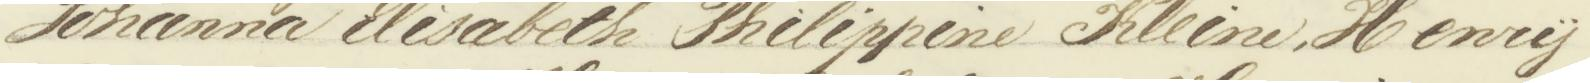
Johanna Elisabeth Philippine Kleine, Henrij
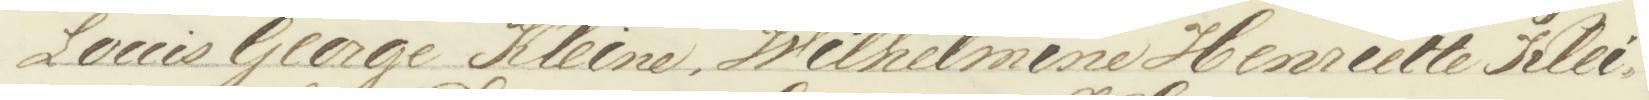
Louis George Kleine, Wilhelmine Henriette Klei„
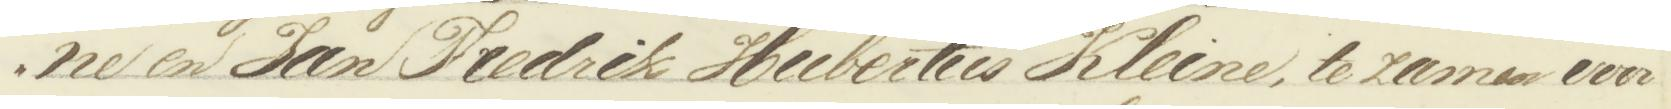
„ne en Jan Fredrik Hubertus Kleine, te zamen voor
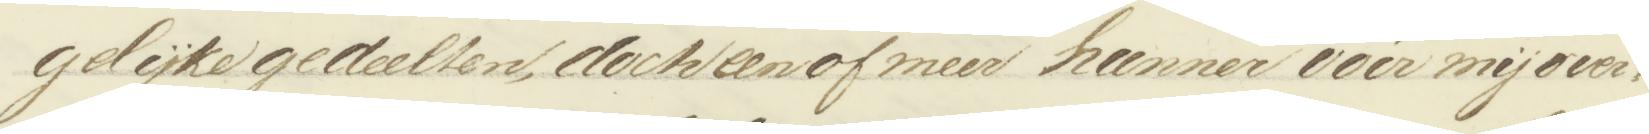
gelijke gedeelten, doch een of meer hunner vóór mij over„
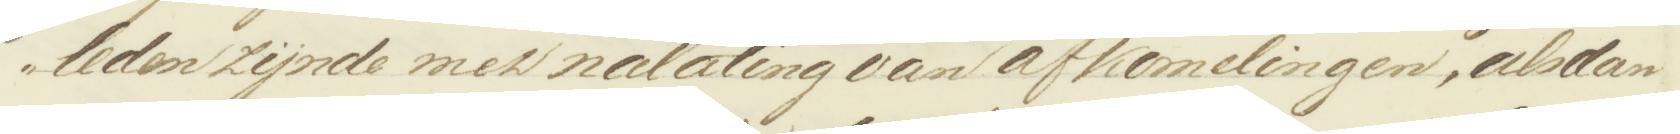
„leden zijnde met nalating van afkomelingen, alsdan
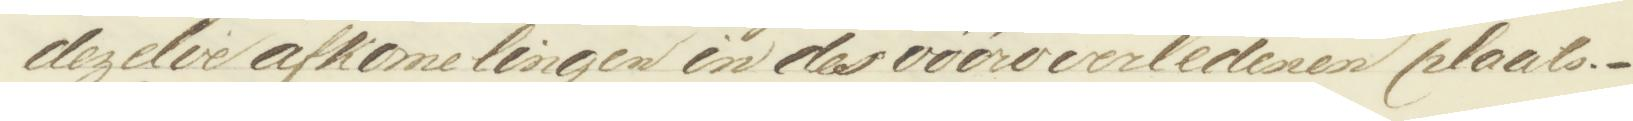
dezelve afkomelingen in des vóóroverledenen plaats.-
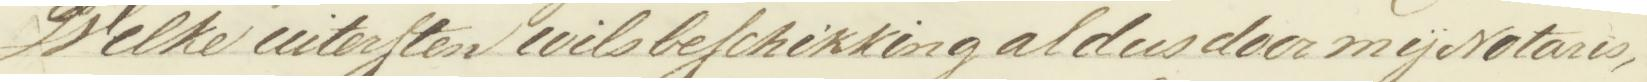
Welke uitersten wils beschikking aldus door mij Notaris,
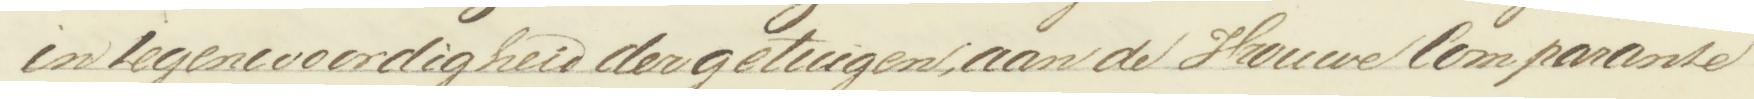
in tegenwoordigheid der getuigen, aan de Vrouwe Comparante
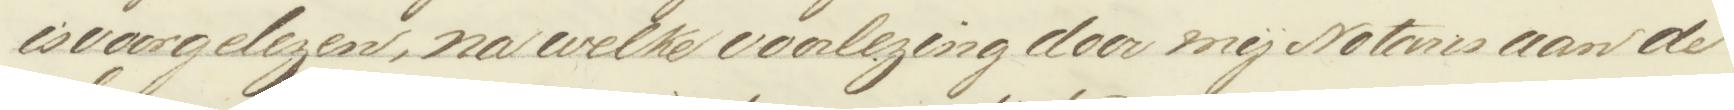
is voorgelezen, na welke voorlezing door mij Notaris aan de
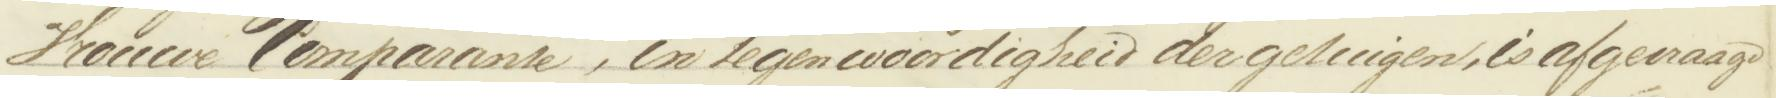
Vrouwe Comparante, in tegenwoordigheid der getuigen, is afgevraagd
